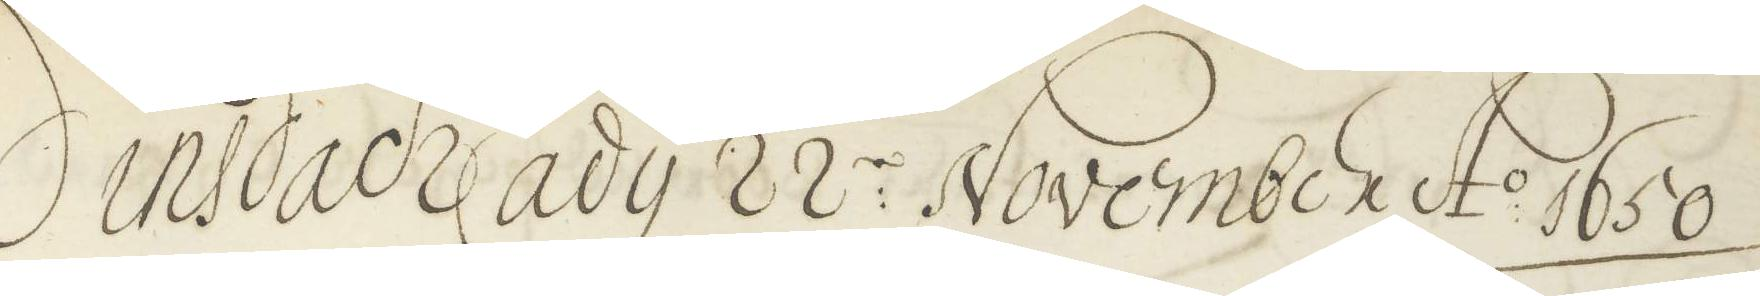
Dinsdach adij 22:' November A:o 1650
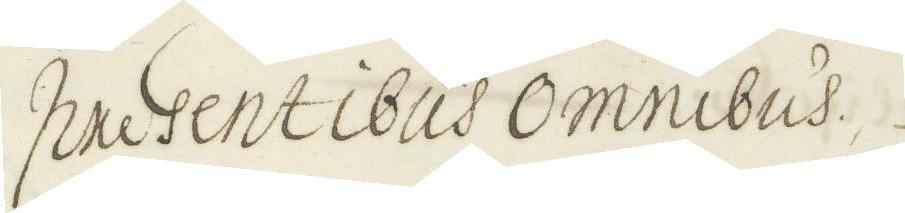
presentibus Omnibus.
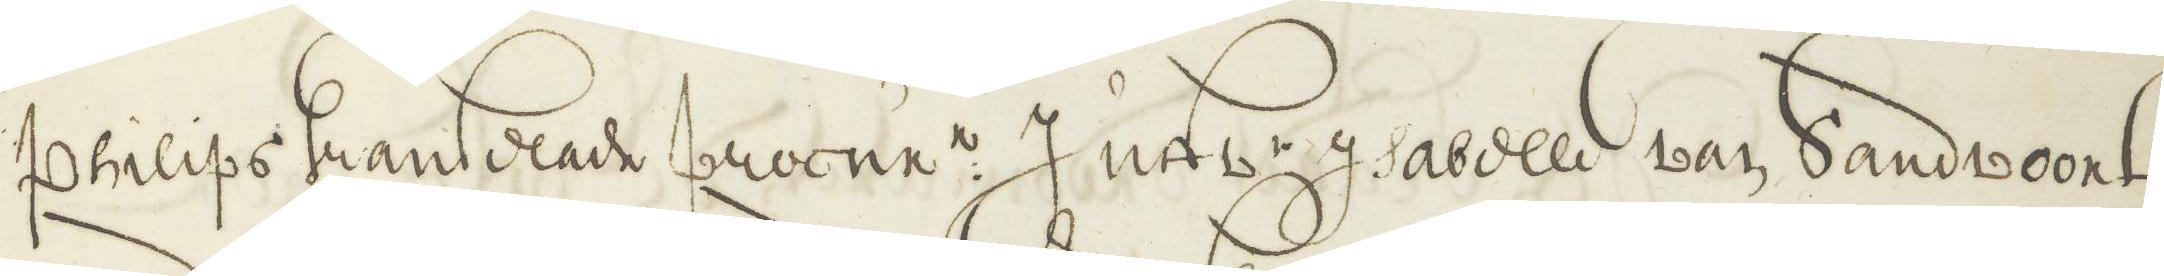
philips kanselaer procur:r Juffvr Isabelle van Sandvoort
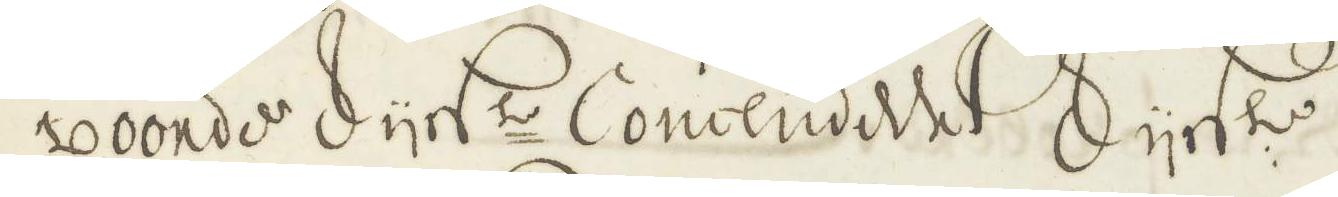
voorde Eijs=se Concludeert Eijss:se
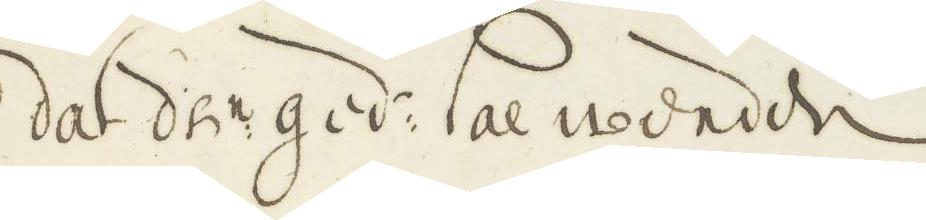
dat d'h:r ged:' sal werden
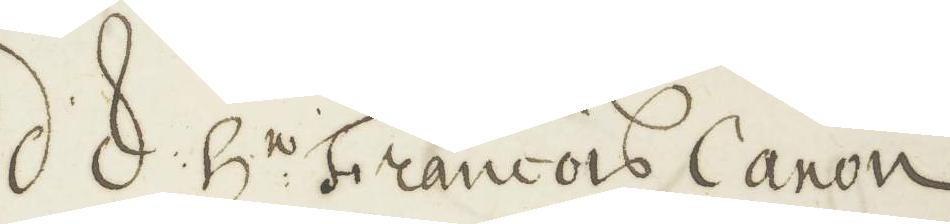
d’ E: h:r Francois Canon
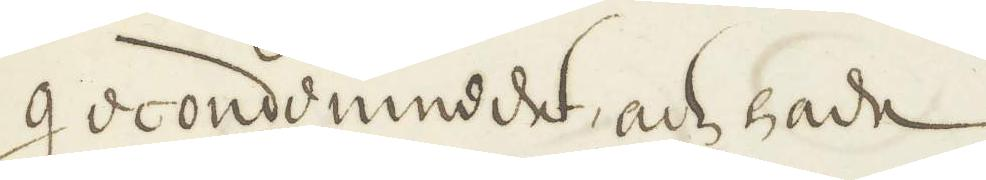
gecondemneert, aen haer
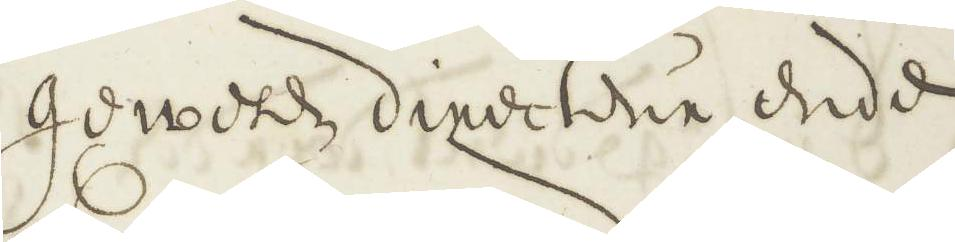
geweten directeur ende
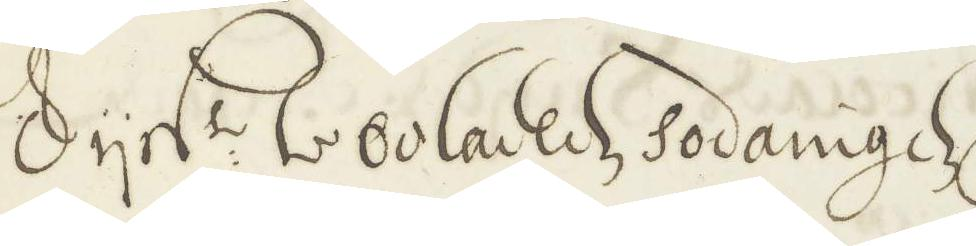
Eijss:l te betaelen sodanigen
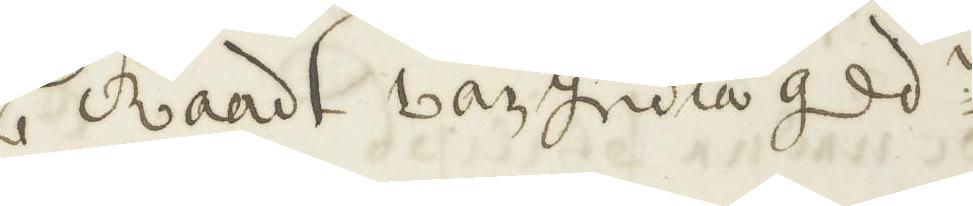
Raadt van Jndia ged=e
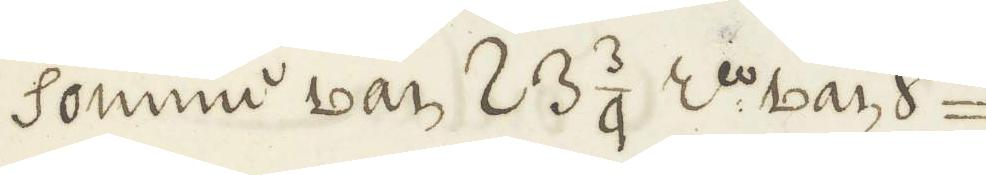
somme van 23¾ r:a van 8=ten
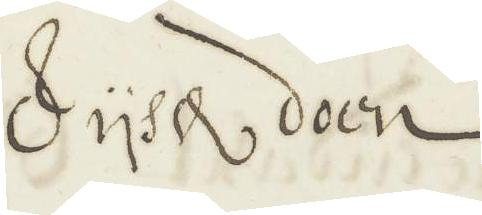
Eijsch doen
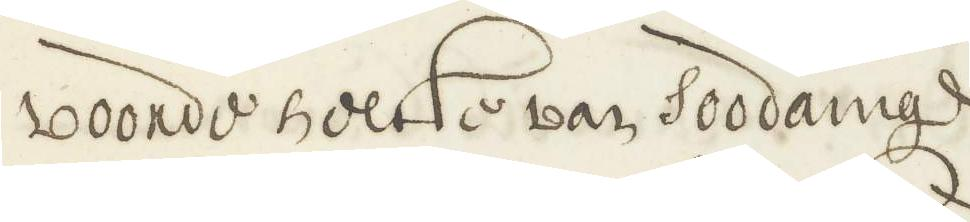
voorde helfte van soodanigen
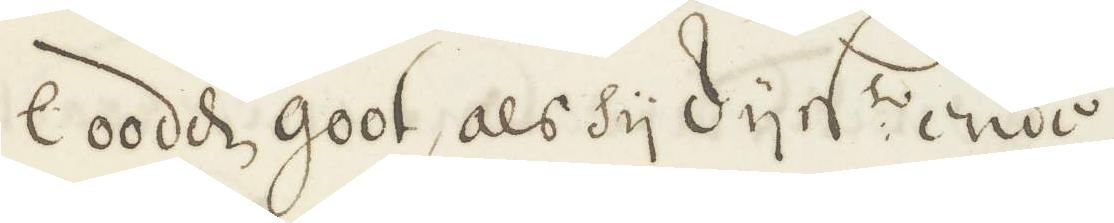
looden goot, als sij Eijss:se ende
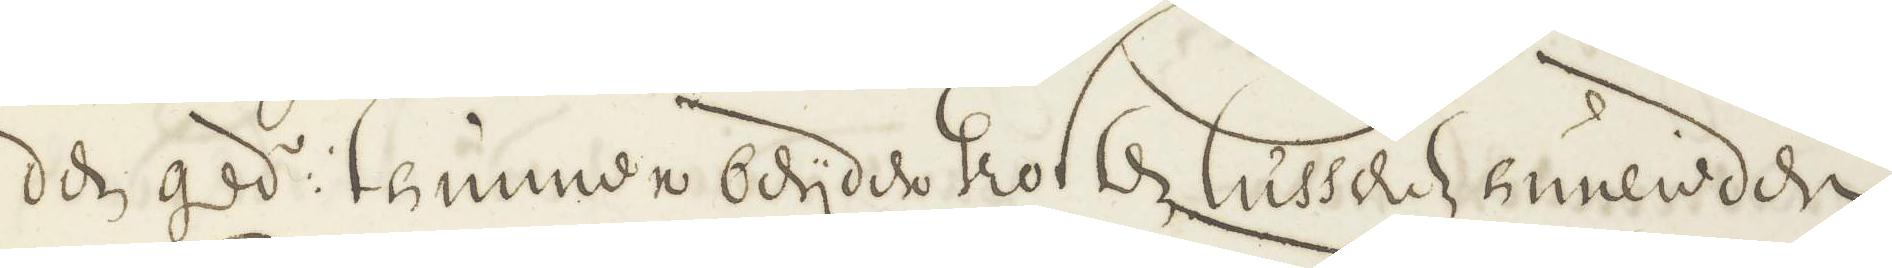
den ged:e t hunner beijder kosten tusschen hunlieden
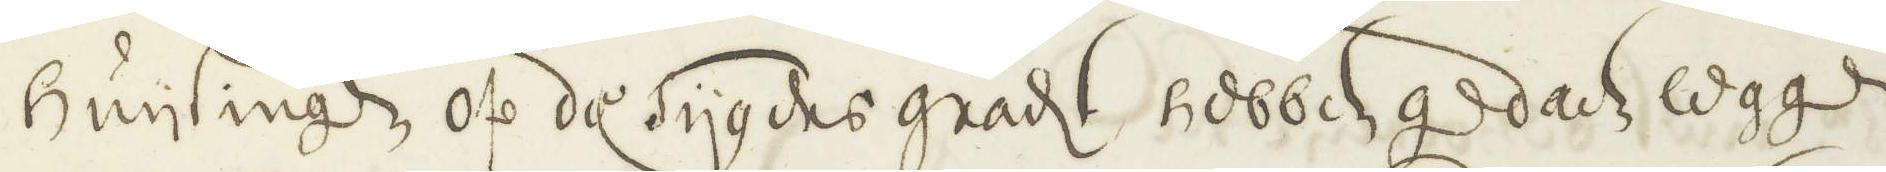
huijsingen op de Tijgers gracht hebben gedaen leggen
